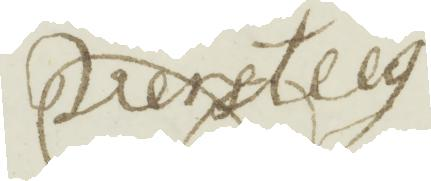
Versteeg
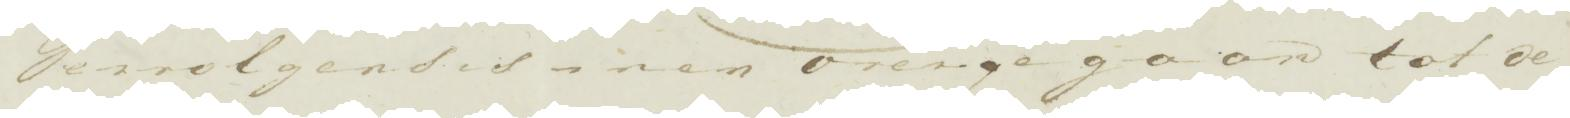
Vervolgens is men overgegaan tot de
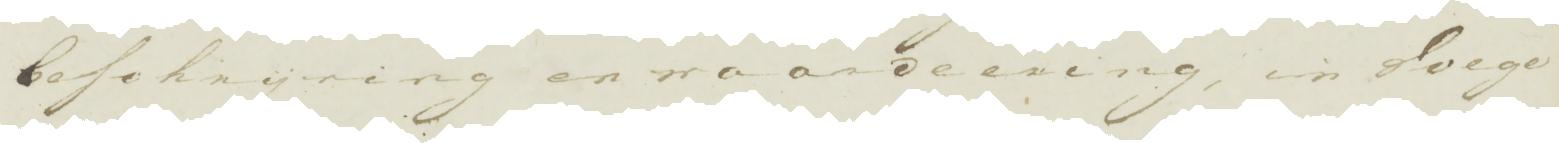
beschrijving en waardeering, in voege
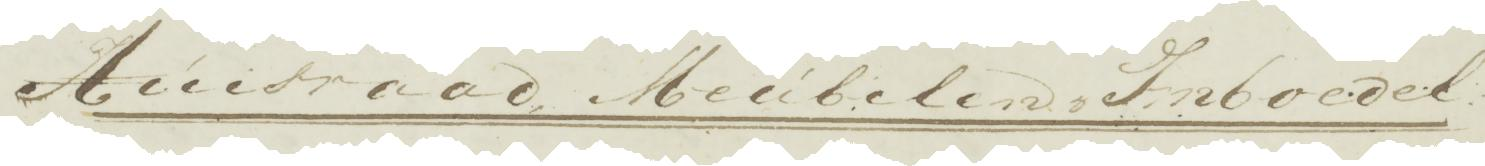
Huisraad, Meubelen & Inboedel
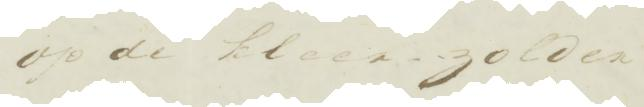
op de kleerzolder
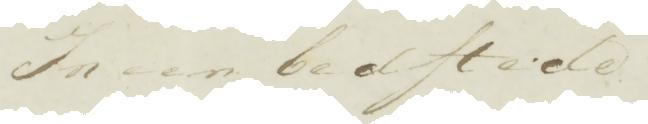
In een bedstede
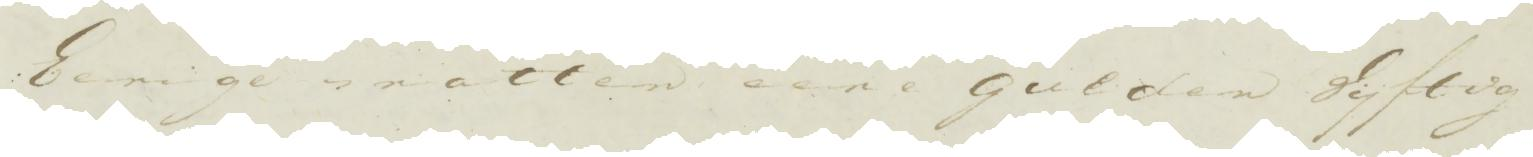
Eenige matten eene Gulden vijftig
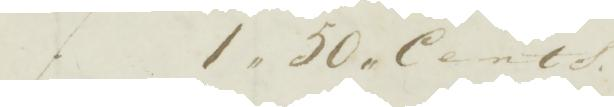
ƒ 1„ 50„ Cents.
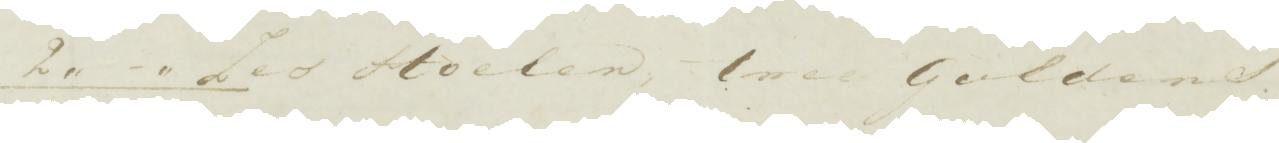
2„ -„ Zes stoelen, twee Guldens.
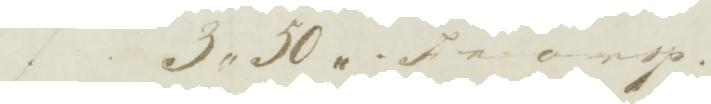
ƒ. 3„ 50„ Transp.
